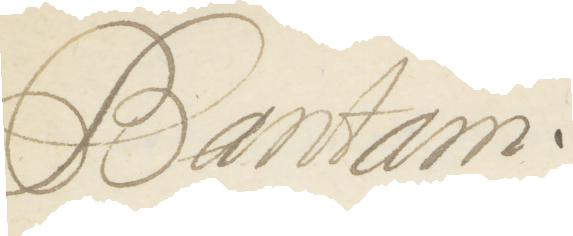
Bantam.
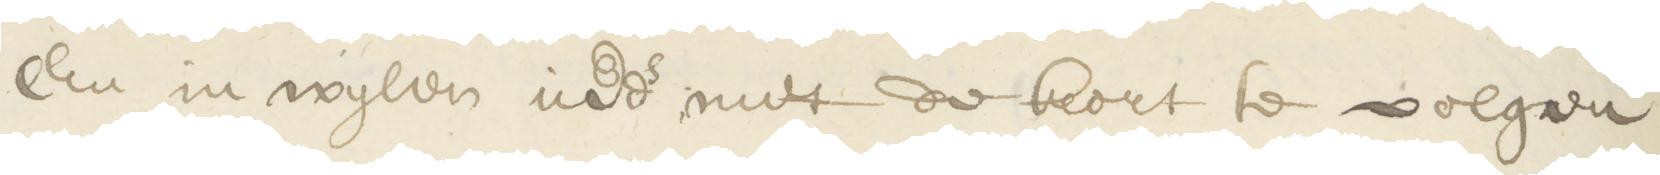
Een in wijlen uEds met de kort te volgen
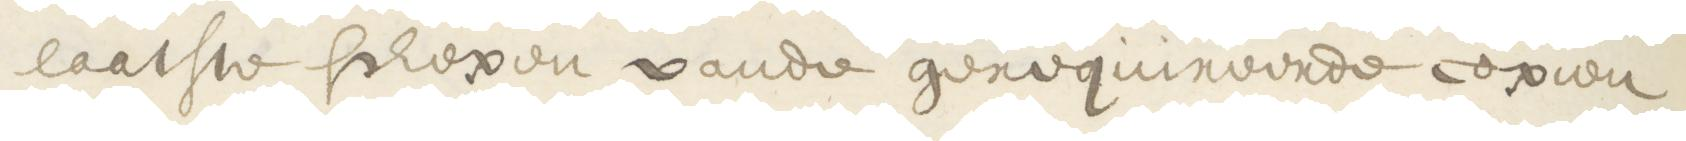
laatste schepen vande gerequireerde copien
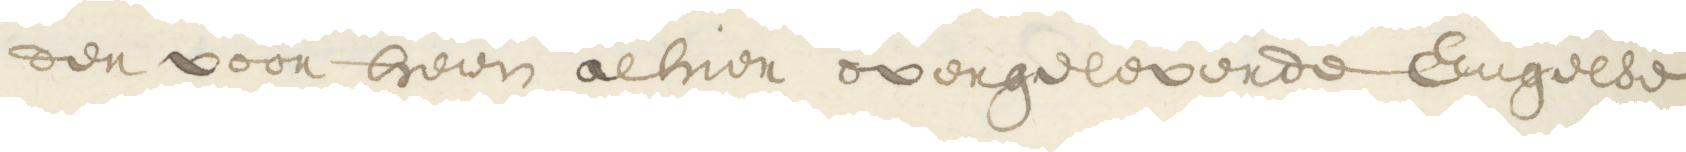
den voor heen alhier overgeleverde Engelse
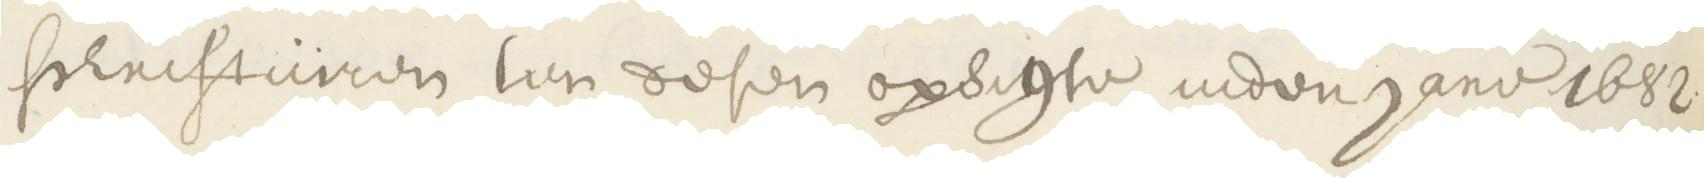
schriftuiren ten desen opsigte inden Jare 1682.
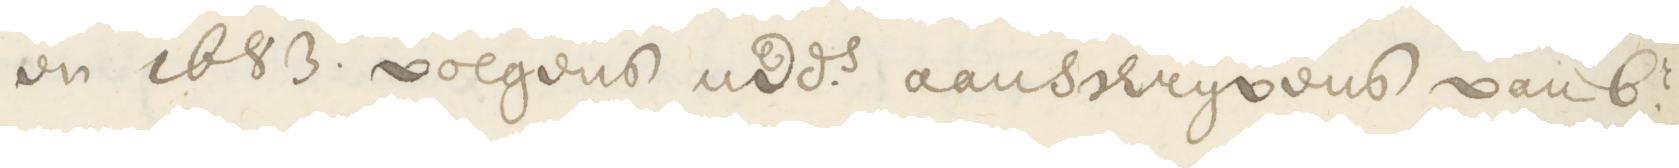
en 1683. volgens uEd.s aanschrijvens van 6.e
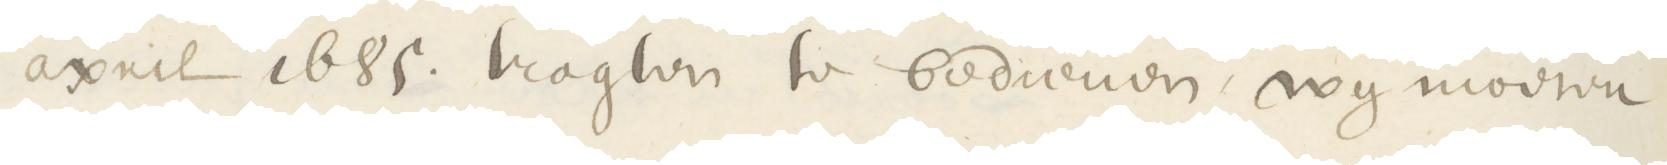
april 1685. tragten te bedienen, wy moeten
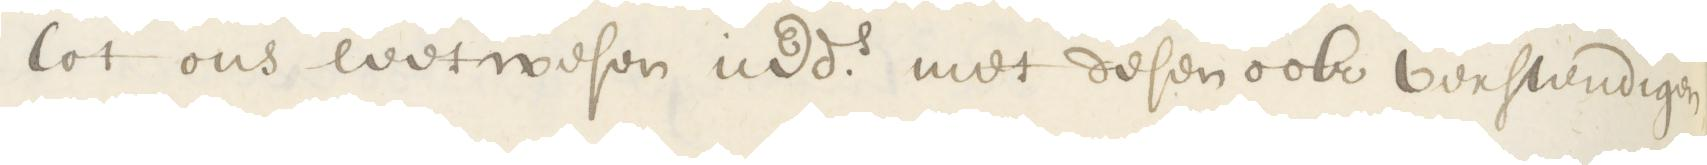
tot ons leetwesen uEd.s met desen ook verstendigen
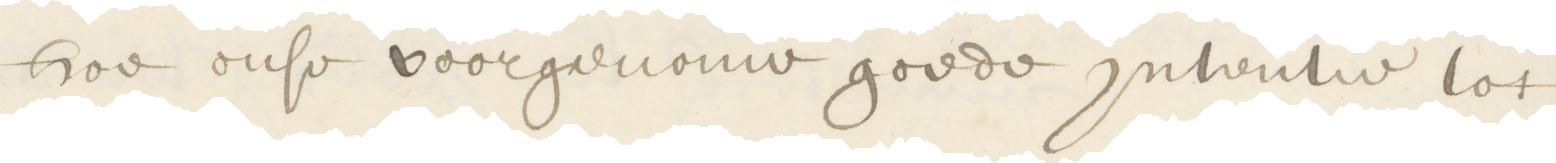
hoe onse voorgenome goede intentie tot
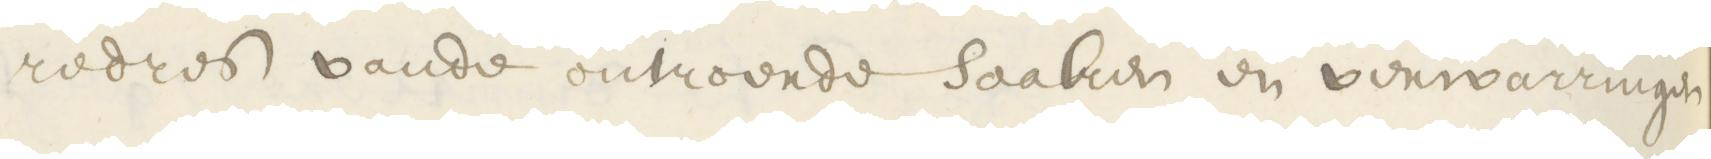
redres vande ontroerde saaken en verwarringen
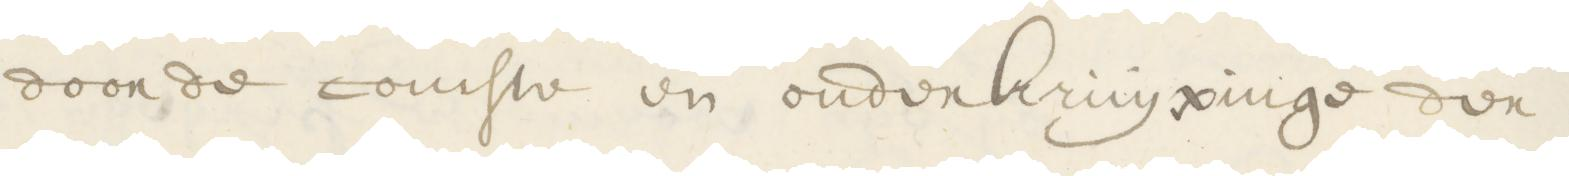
door de comste en onderkruijpinge der
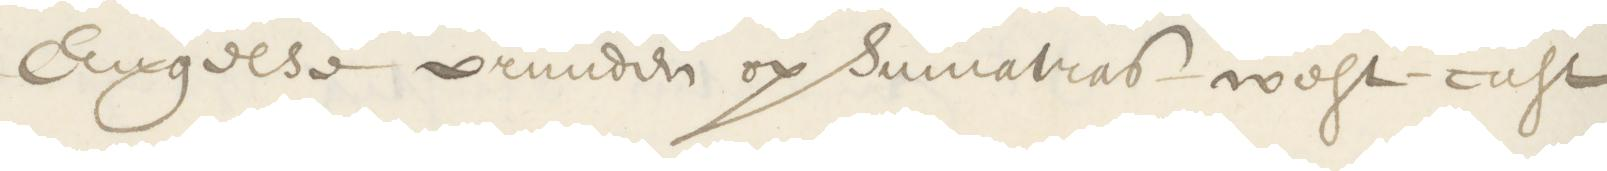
Engelse vrimden op Sumatras-west-cust
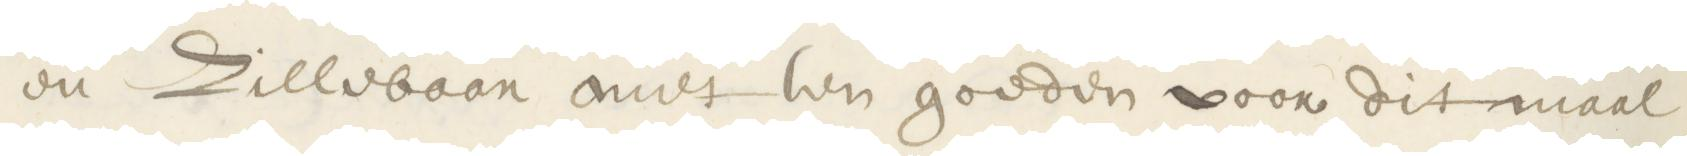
en Zillebaar niet ten goeden voor dit maal
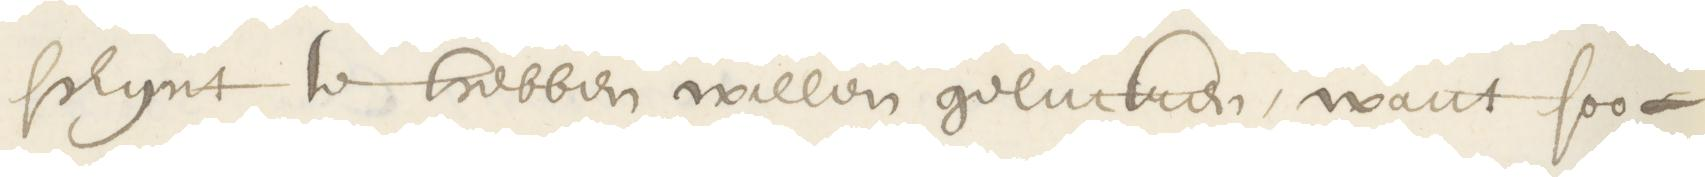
schynt te hebben willen gelucken, want soo-
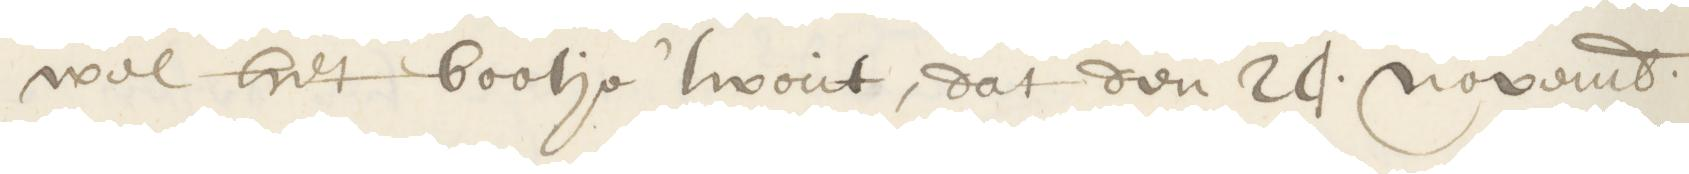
wel het bootje 'twout, dat den 24. november.
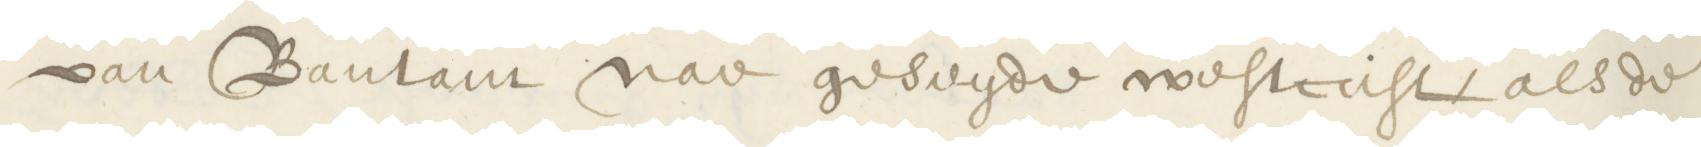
van Bantam nae geseijde westcust, als de
